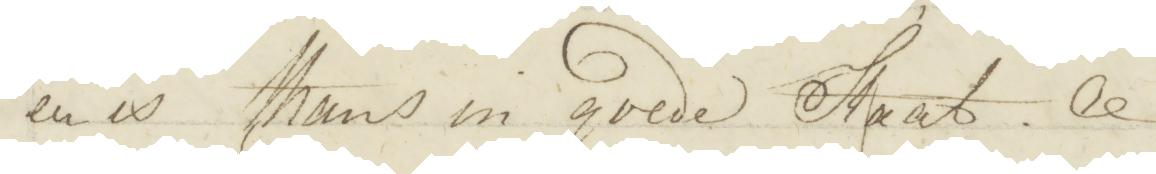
en is thans in goede staat.
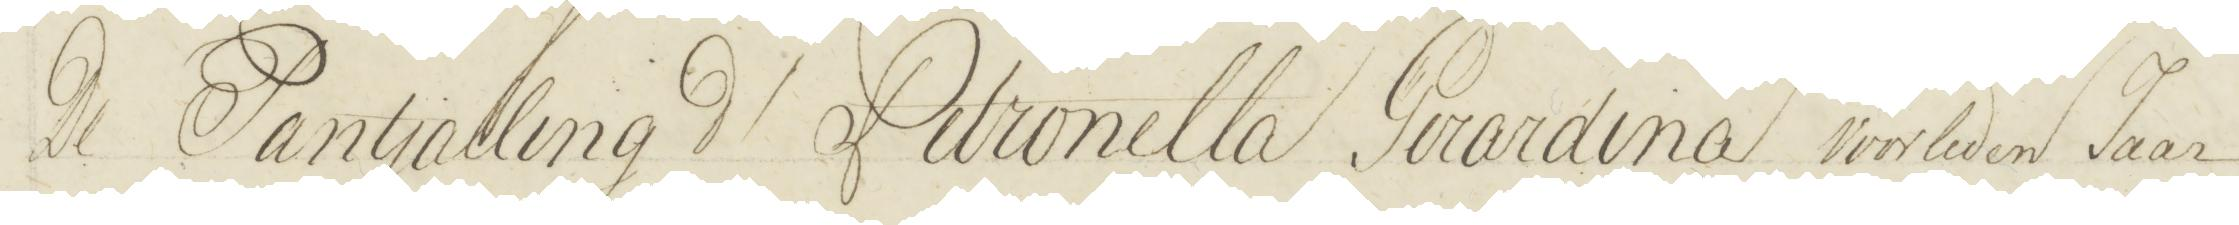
de Pantjalling d’ Petronella Gerardina voorleden Jaar
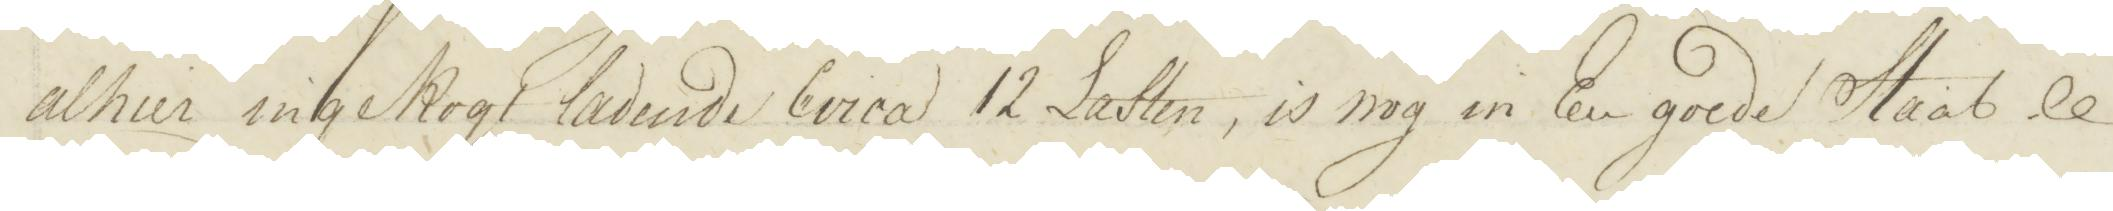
alhier ingekogt ladende Circa 12 Lasten, is nog in Een goede Staat
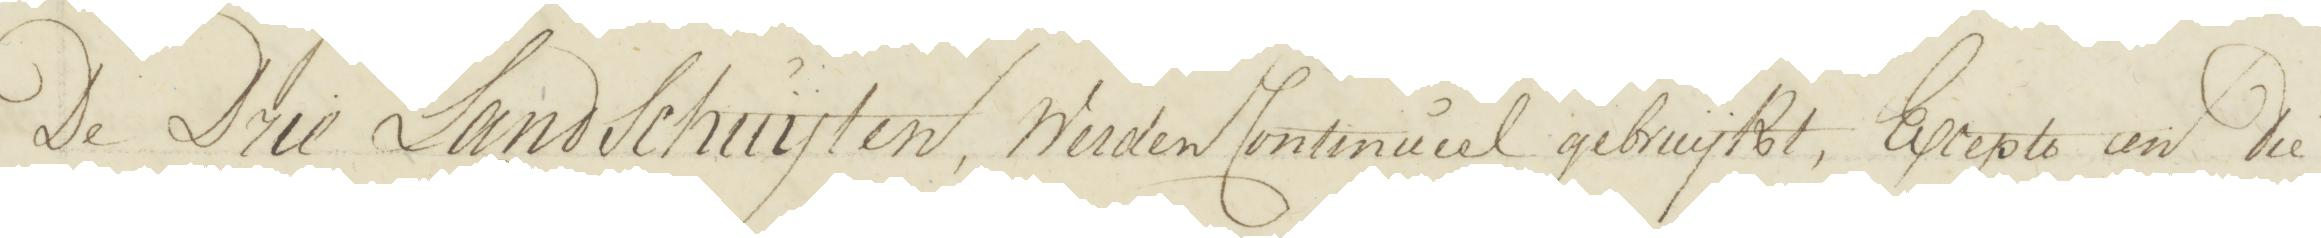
De Drie Landschuijten, Werden Continueel gebruijkt, Excepto een die
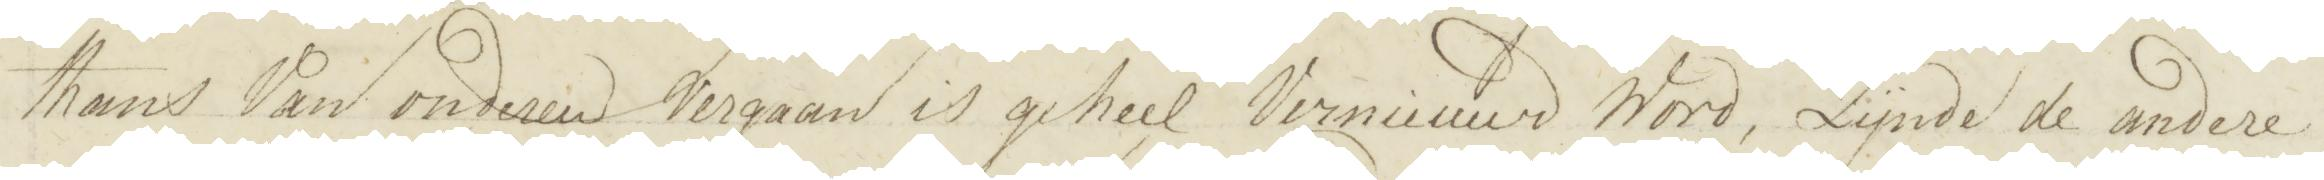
thans Van onderen vergaan is geheel vernieuwd word, zijnde de andere
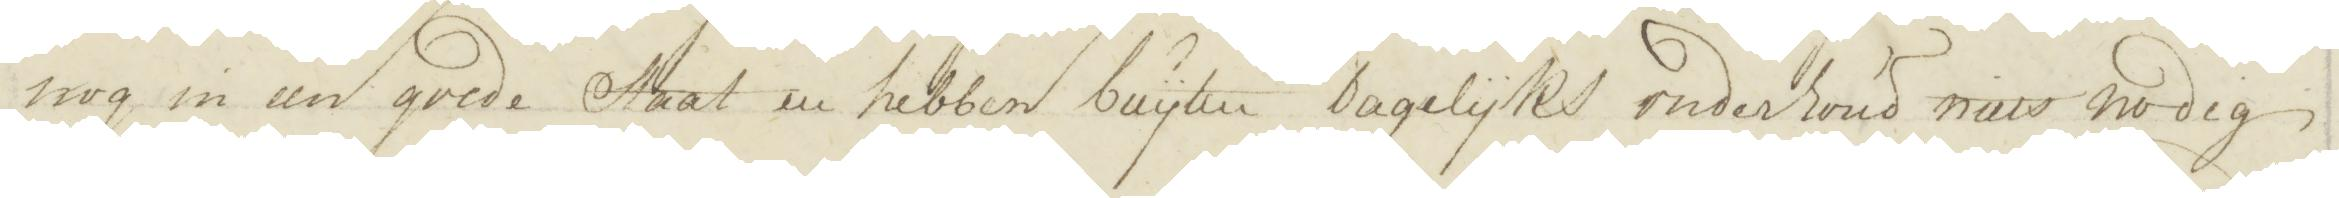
nog in een goede staat en hebben buijten dagelijks onderhoud niets nodig
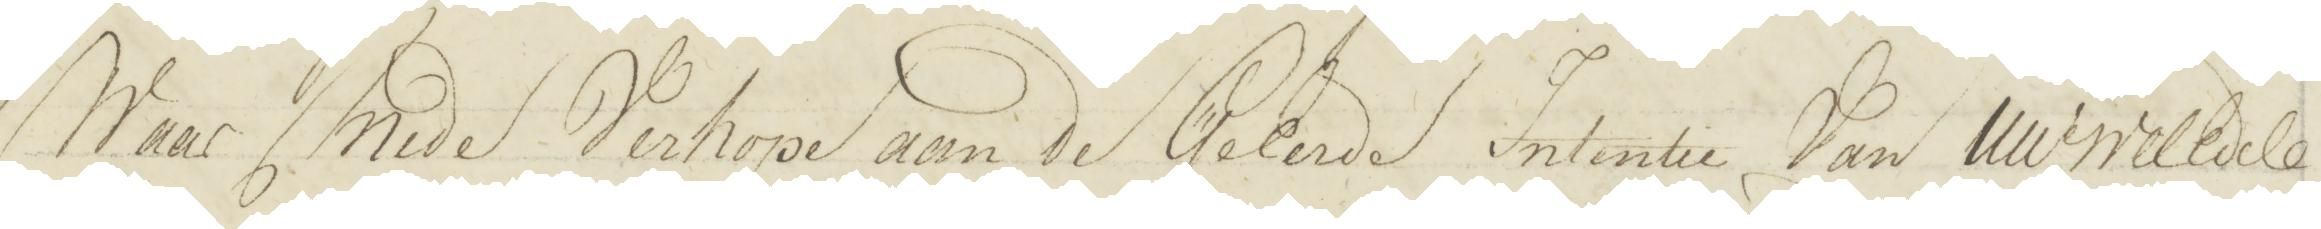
Waar Mede Verkope aan de Gelerde Jntentie Van Uw WelEdele
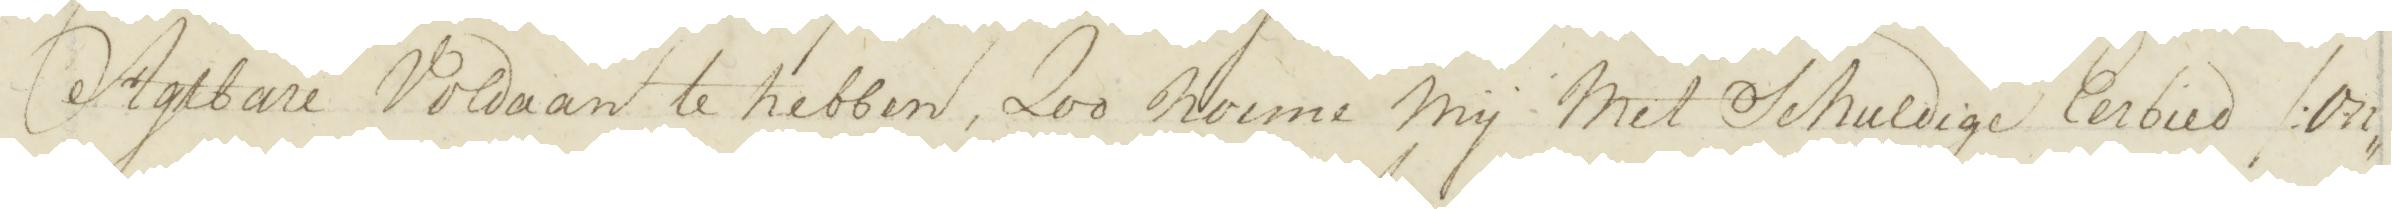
Agtbare voldaan te hebben, zoo noeme mij met Schuldige Eerbied /: on„
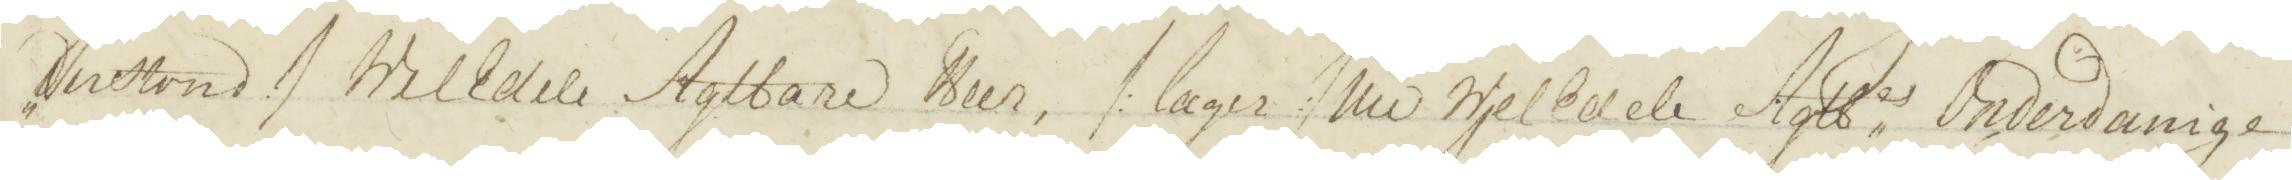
„derstond :/ WelEdele Agtbare Heer, /:lager:/ uw wel Edele Agtb„es Onderdanige
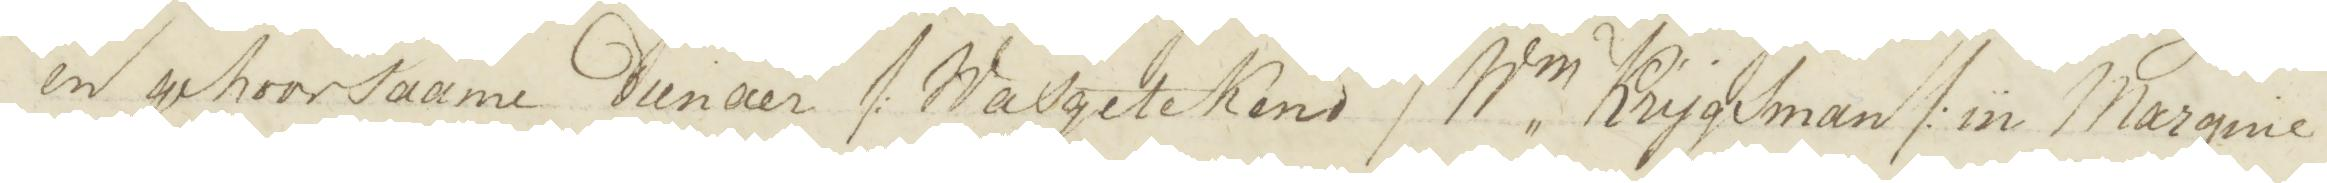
en gehoorsaame dienaer /: Was getekend / W„m Krijgsman /: in Margine
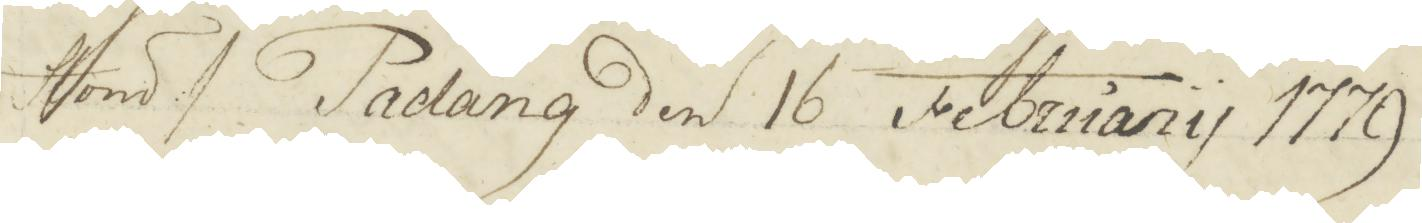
stond :/ Padang den 16 Februarij 1779
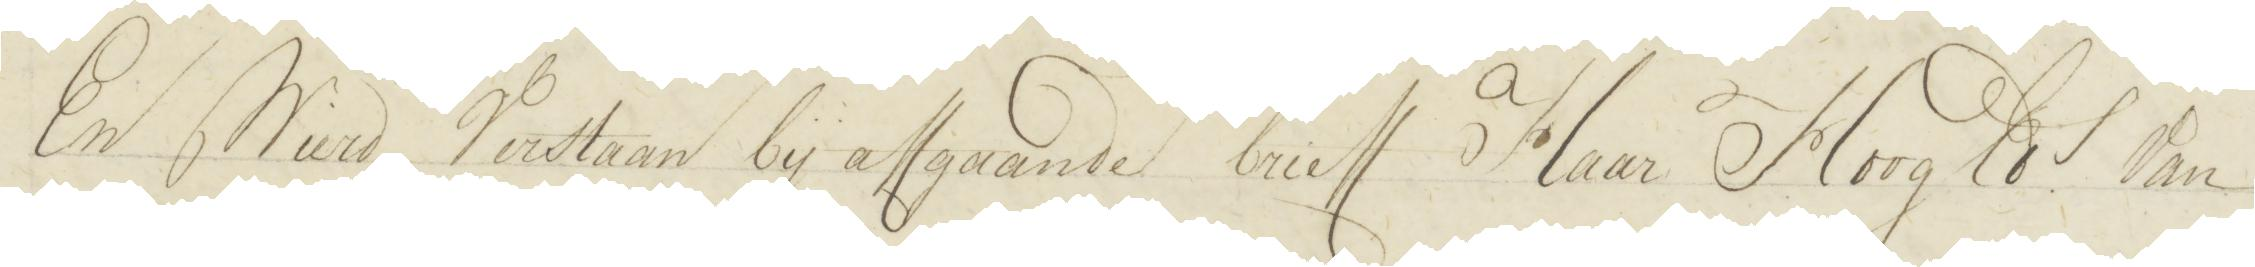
En Wierd Verstaan bij afgaande brieff Haar Hoog Ed.s van
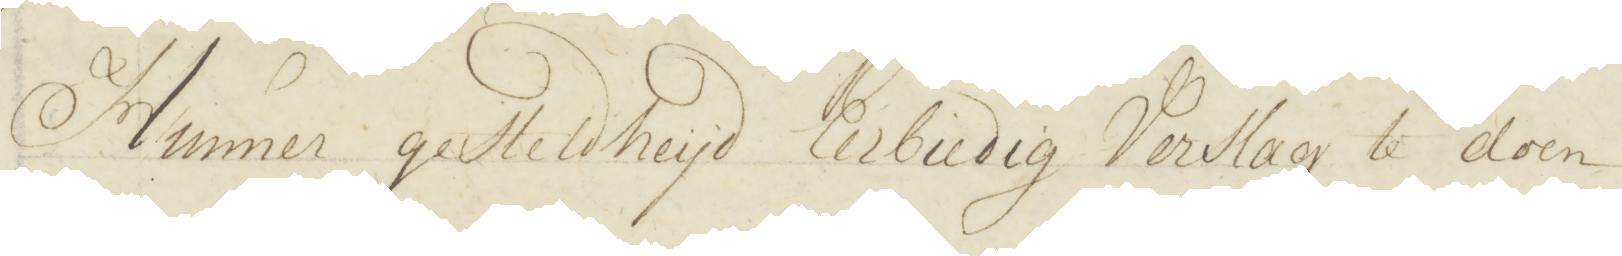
Hunner gestellheijd Eerbiedig Verslag te doen
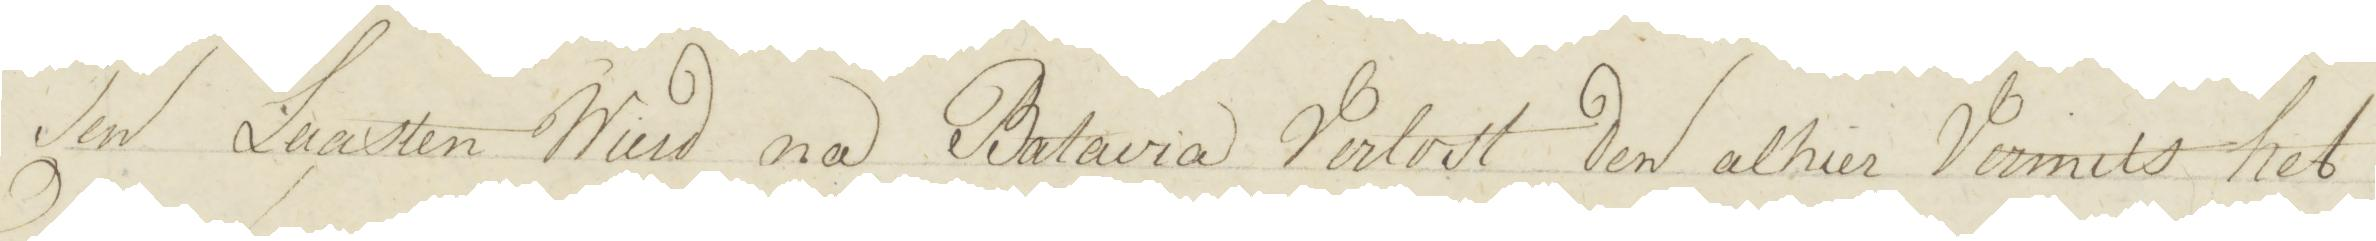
Ten Laasten Wierd na Batavia Verlost den alhier Vermits het
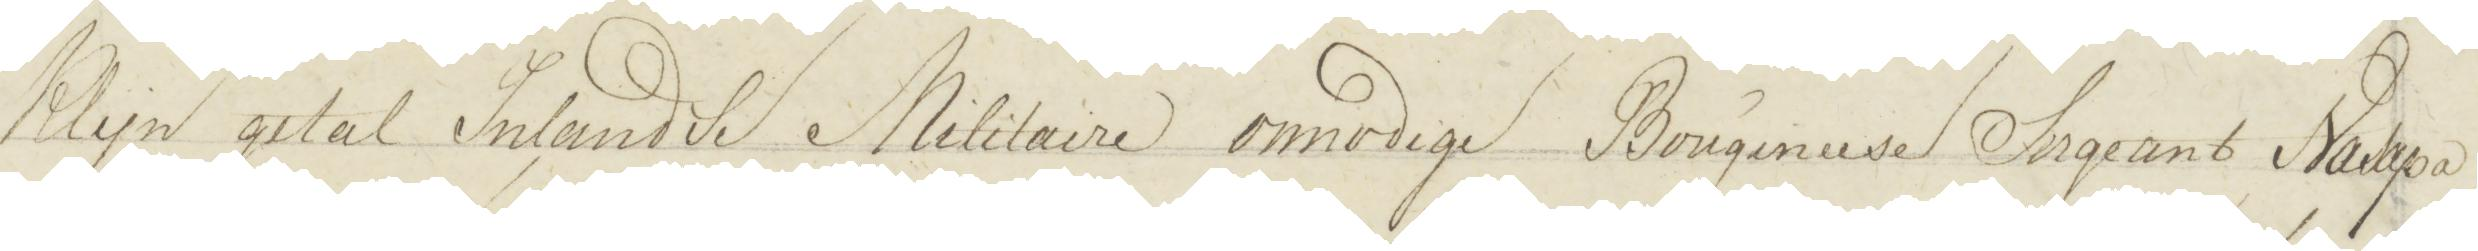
Klijn getal Jnlandse Militaire onnodige Bougineese Sergeant Nasapa
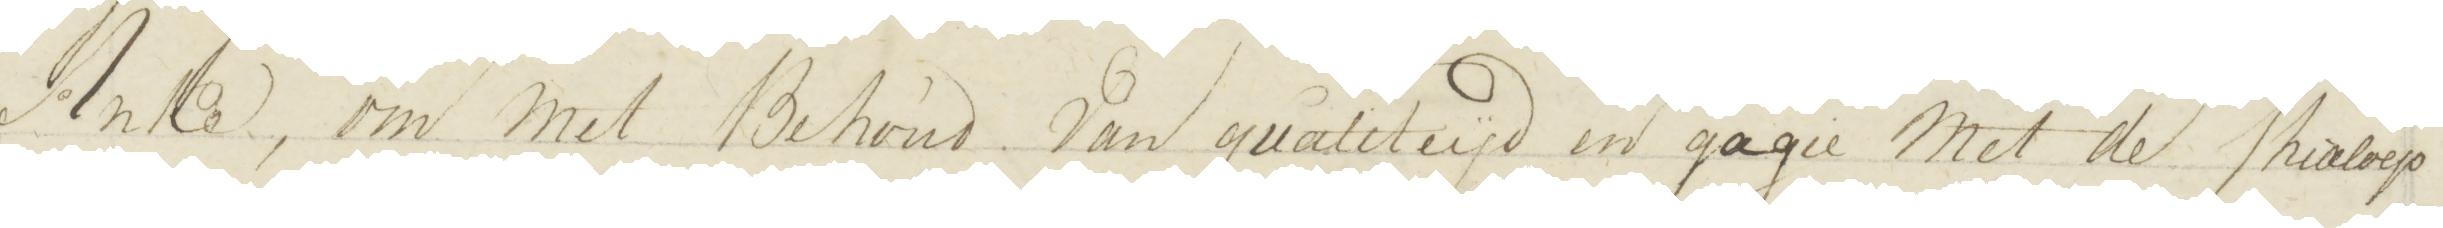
Anke, om met Behoud van qualiteijd en gagie met de Chialoep
